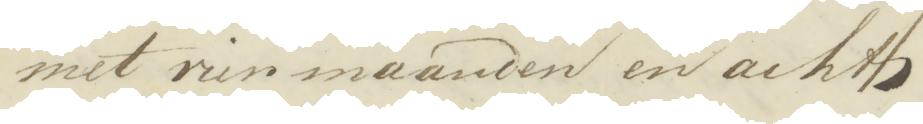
met vier maanden en acht
